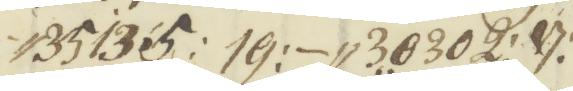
„13513'5: 19:—„30302:17.
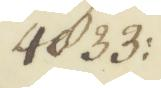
4833
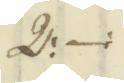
2: —
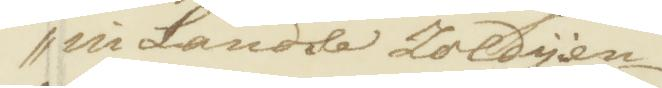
„ in Landse zoldijen
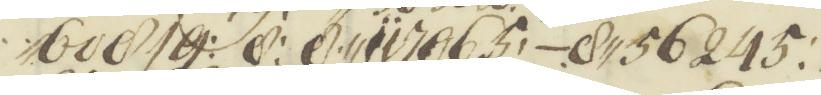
„60819: 8 8:„ 117065:—8„56245:
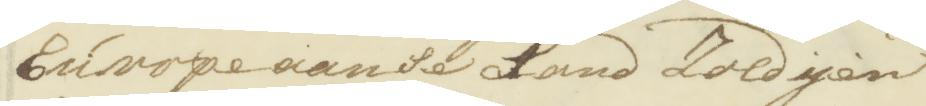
Europeaanse Land zoldijen
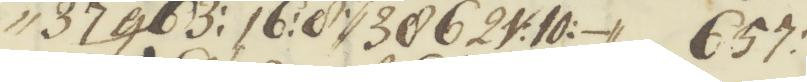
„37963:16:8:„38621:10:—„ 657
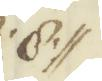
8:„
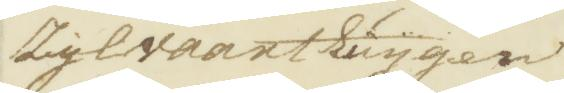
zijlvaarthuijgen
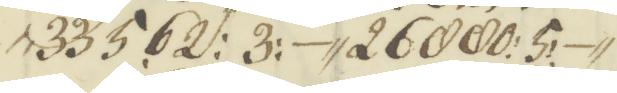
„335.62: 3:—„ 26880:5:—
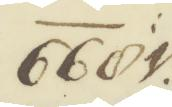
6681
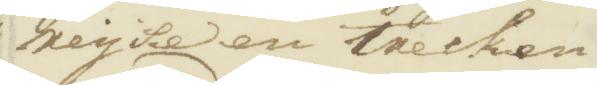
reijse en trecken
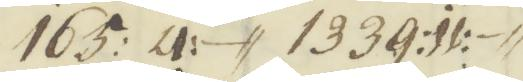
165: 4:—„ 1339:11:–„
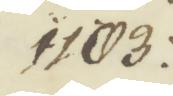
1183
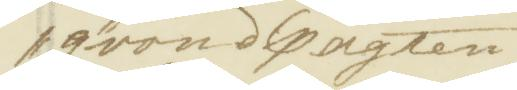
„grond pagten
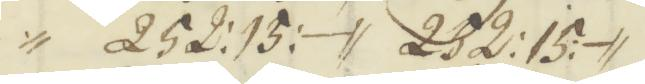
„ 252:15:—„ 252:15:–„
